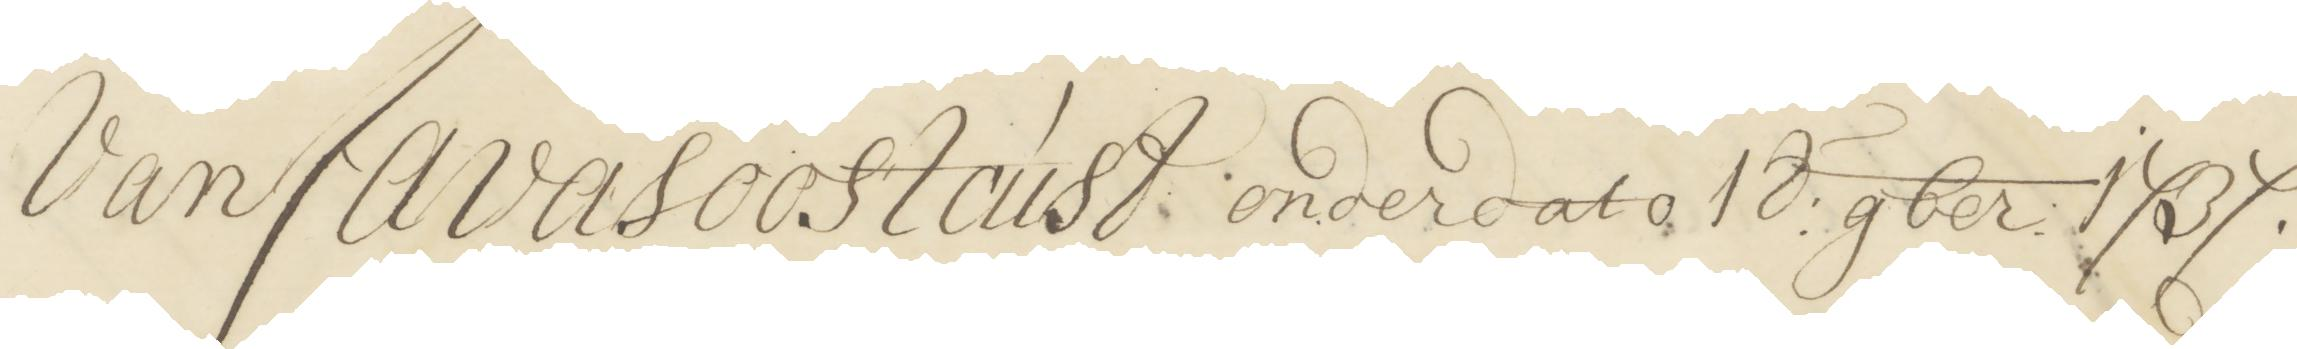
Van Java's oost cust onder dato 18:' 9ber: 1737.
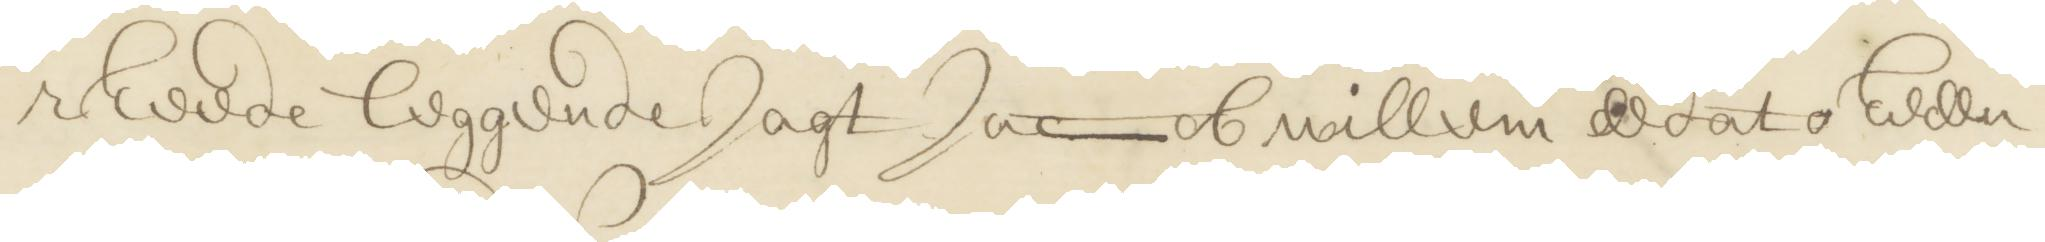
rheede leggende Jagt Jacob willem de dato heden
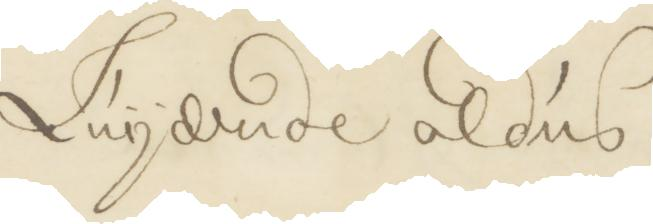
Luijdende aldus
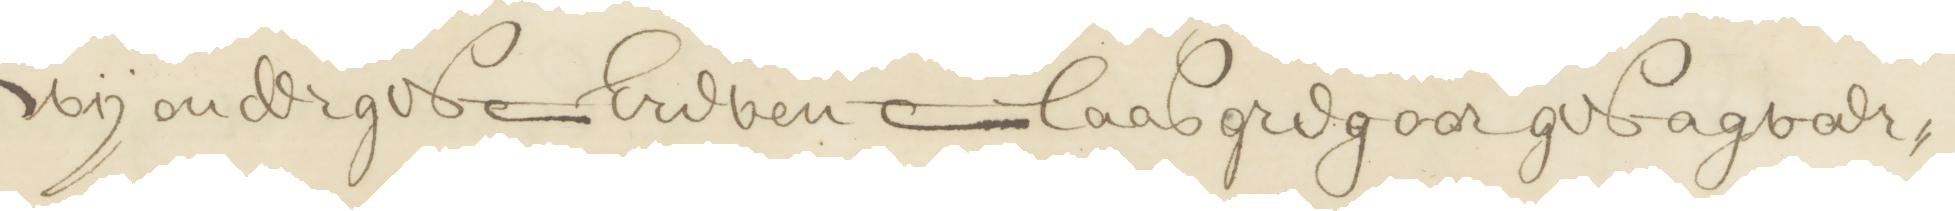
wij ondergeschreven claas gregoor gesagvoer„
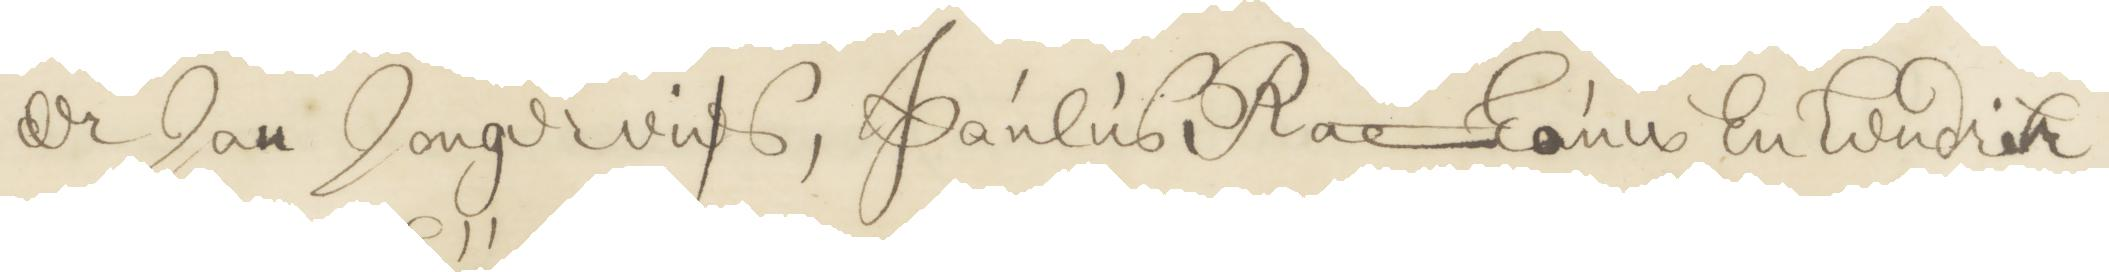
der Jan Jongereies, Paulus Rachouw En hendrik
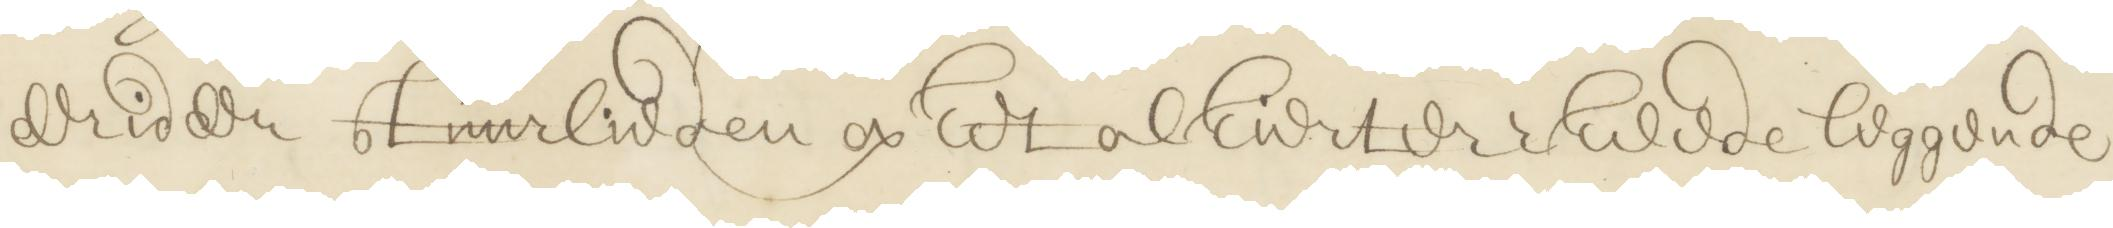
de ridder stuurlieden op het alhierter rheede leggende
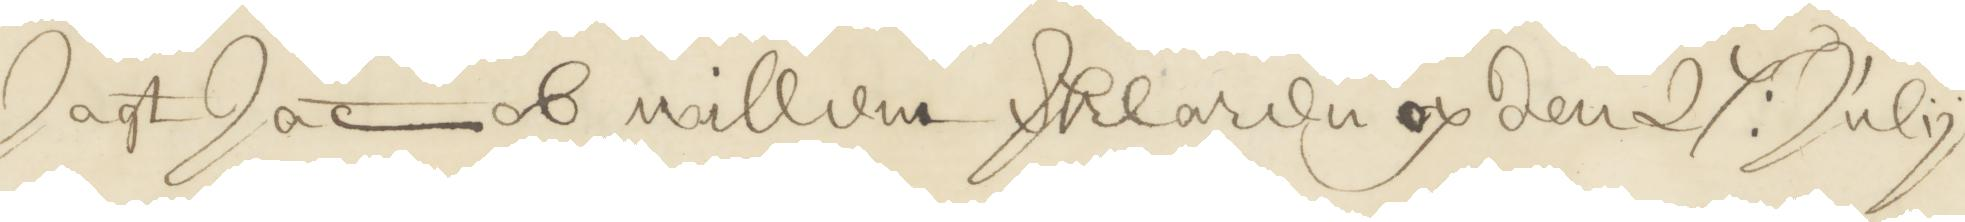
Jagt Jacob willem verklaren op den 27:' Julij
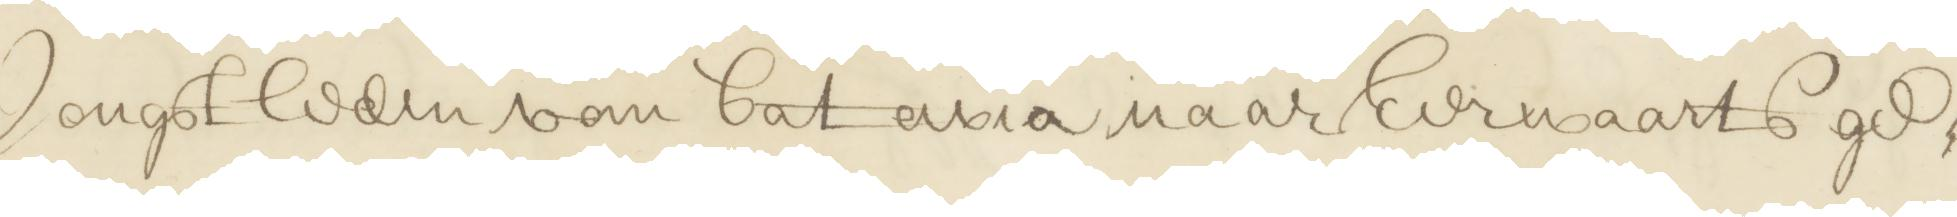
Jongst leden van batavia naar herwaarts ge
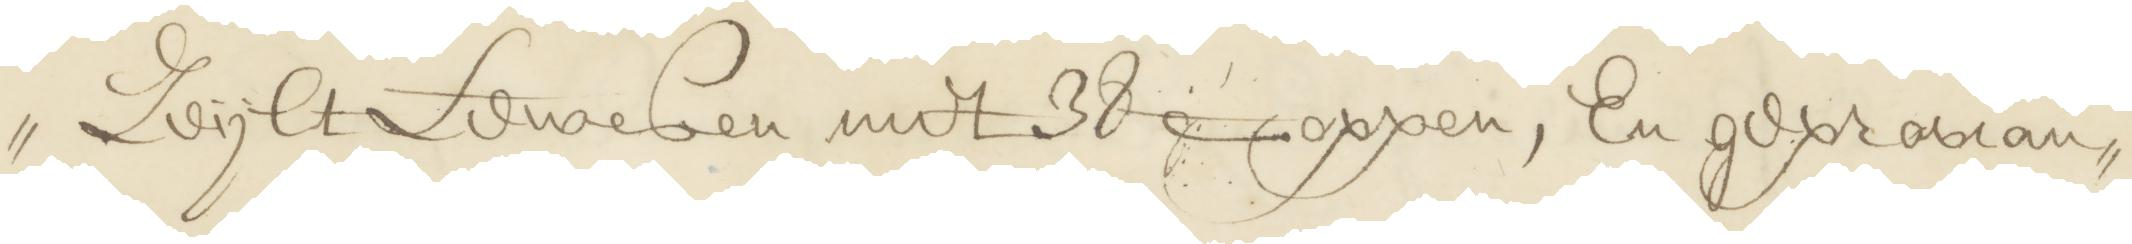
„zeijlt tewesen met 38 coppen, En geprovian„
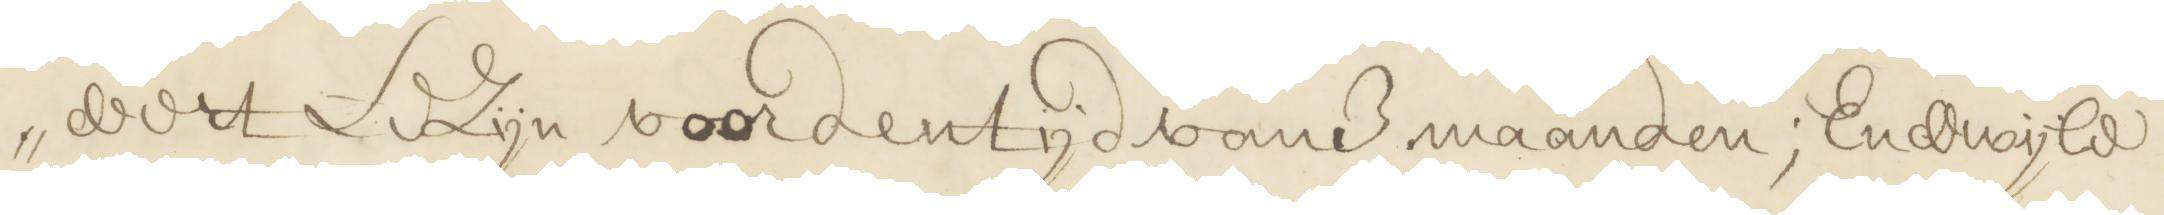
„deert tezijn voor dentijd van 3 maanden; En dewijle
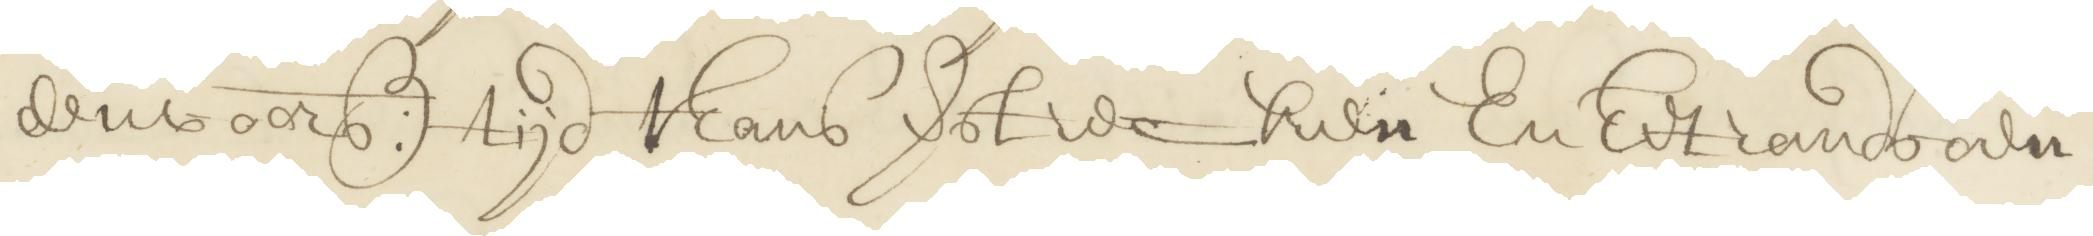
denvoorsz: tijd thans verstrecken En het randsoen
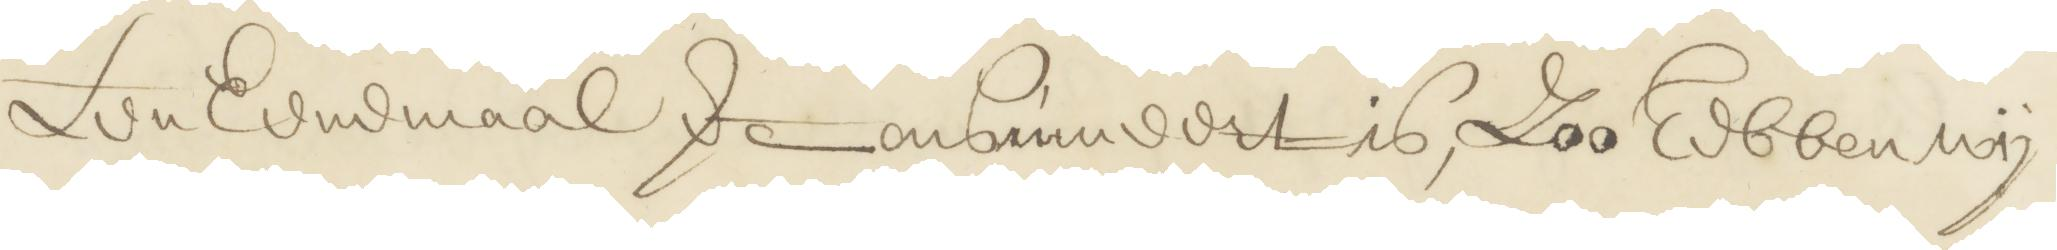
ten Eenemaal verconsumeert is, zoo hebben wij
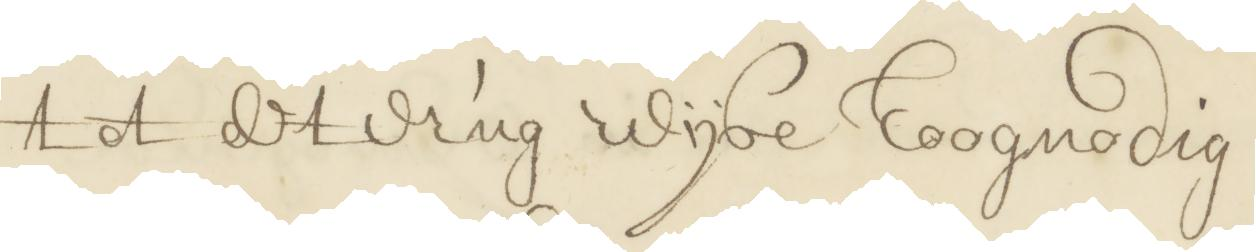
tot de terug reijse hoognodig
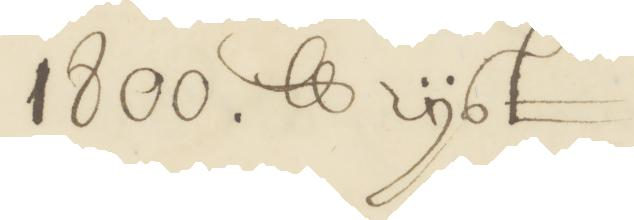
1800. lb rijst
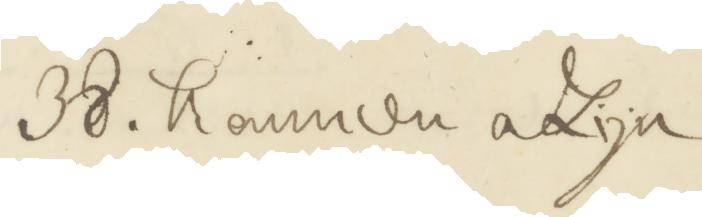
38. kannen azijn
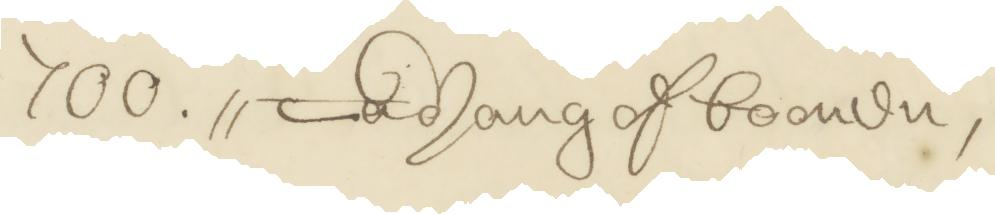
700. „ cadjang of boonen,
